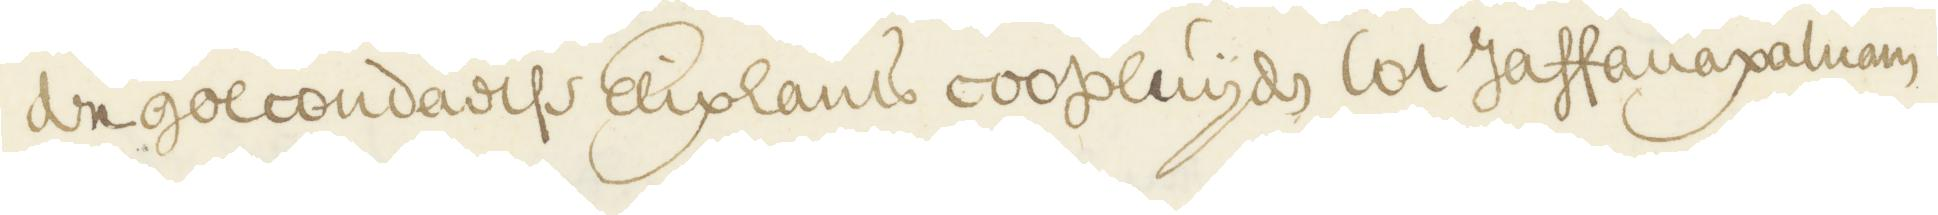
der golcondaetse Eliphants coopluijden tot Jaffanapaluam
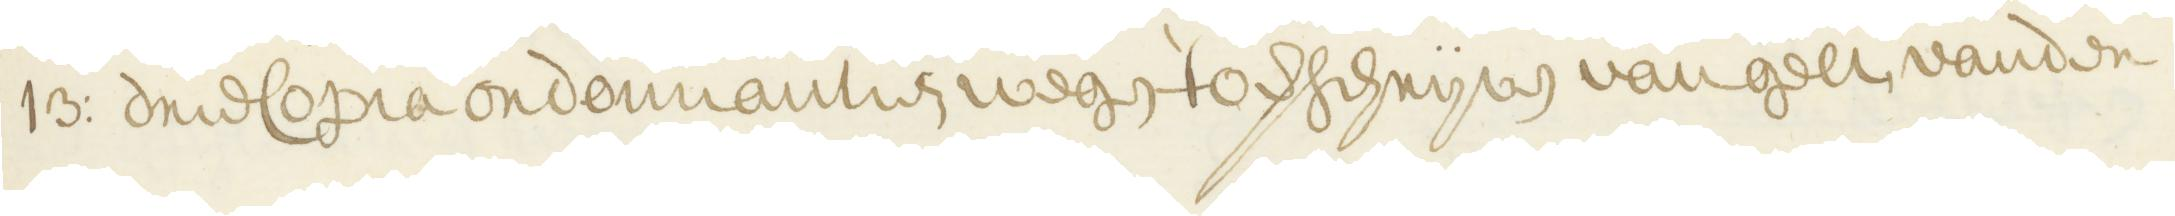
13: drieCopia ordonnantien wegen 'toverschrijven van gelt, vander
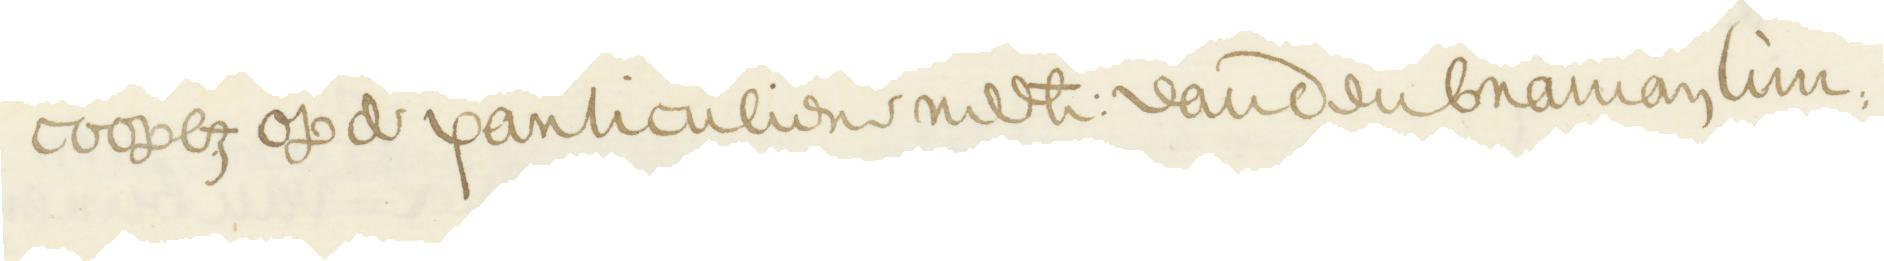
coopln op de particuliere reek: van den braman tim„
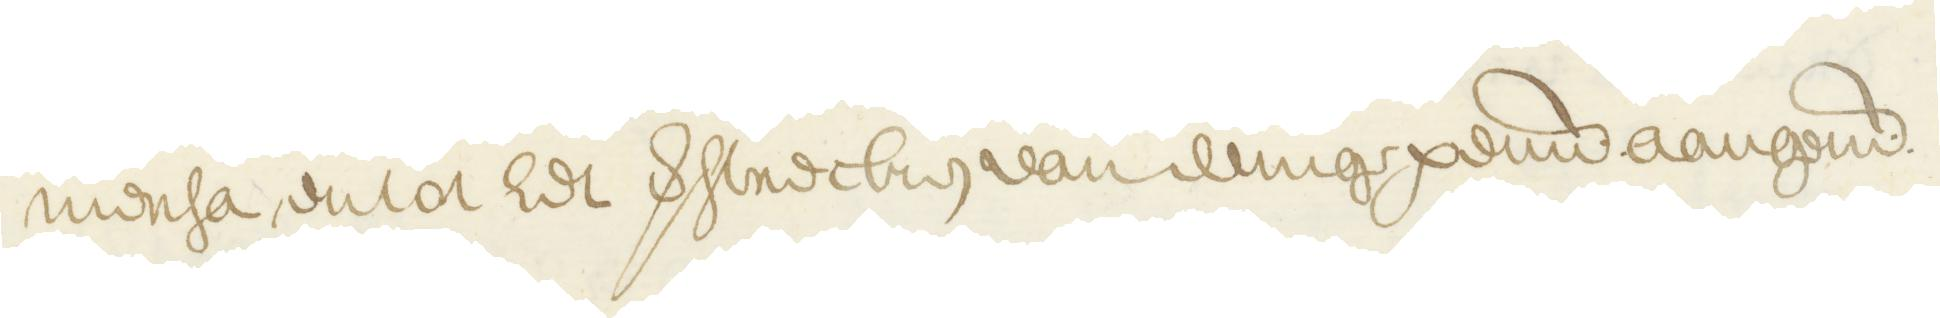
mensa, en tot het verstrecken van eenige penn: aangem:
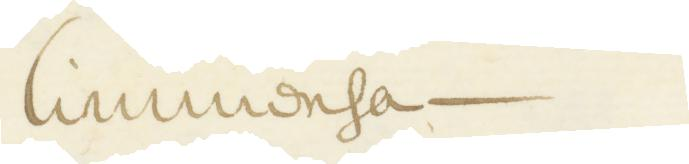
timmersa —
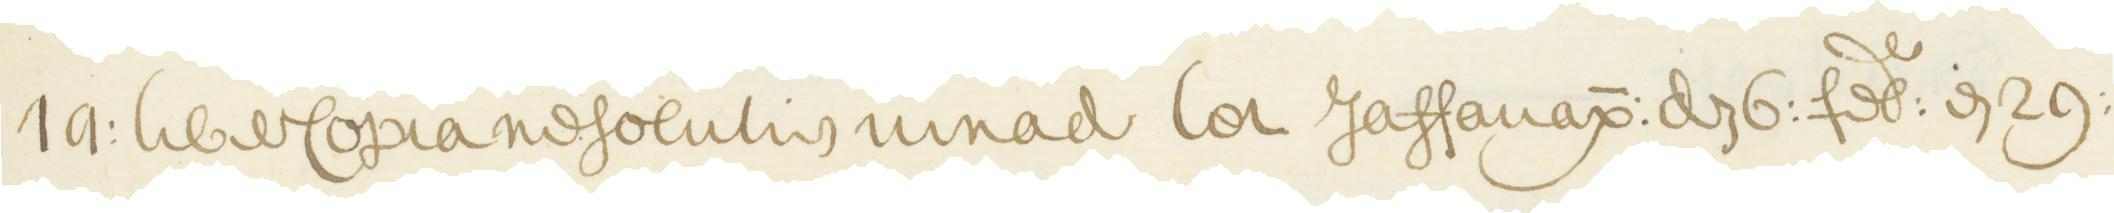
14: tweeCopia resolutien inrade tot Jaffanap: den 6: feb:e en 29:
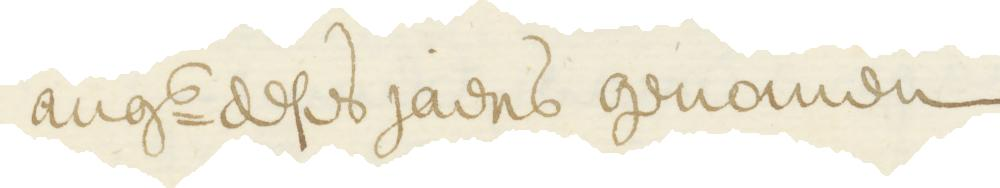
aug=s deses jaers genomen
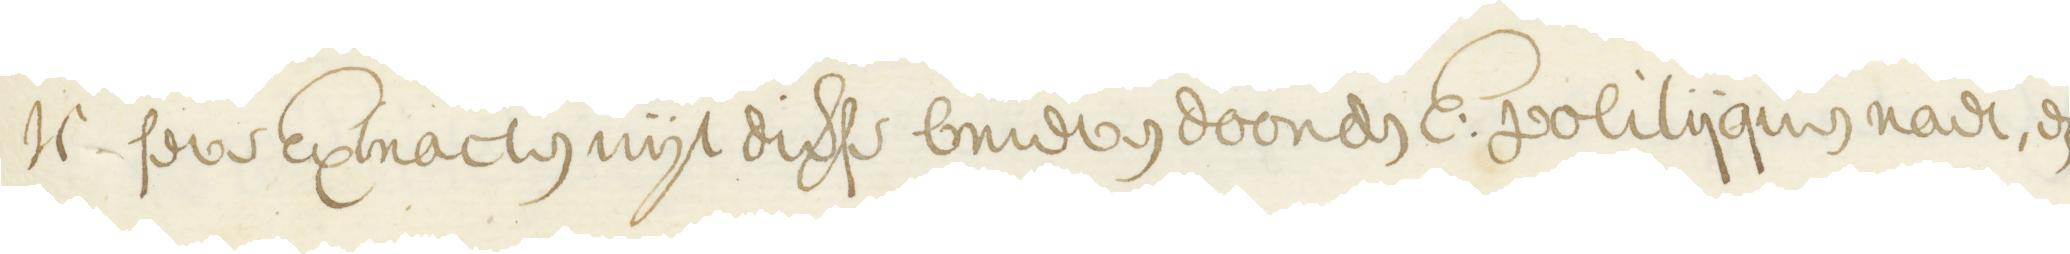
15 seve Extracten uijt diverse brieven doorden E: politijquen raet, en
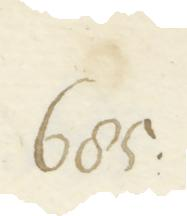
685.
